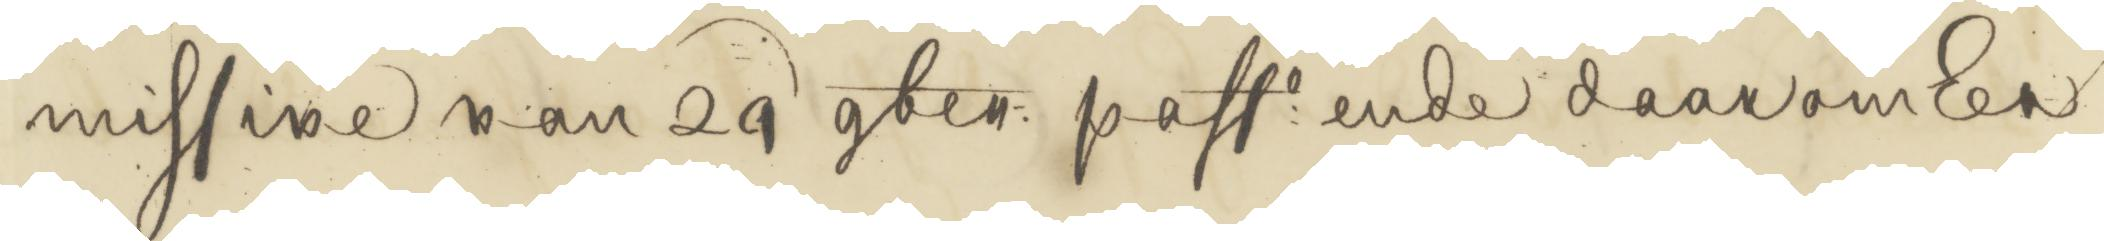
missive van 24 gber: pass:o ende daar om her
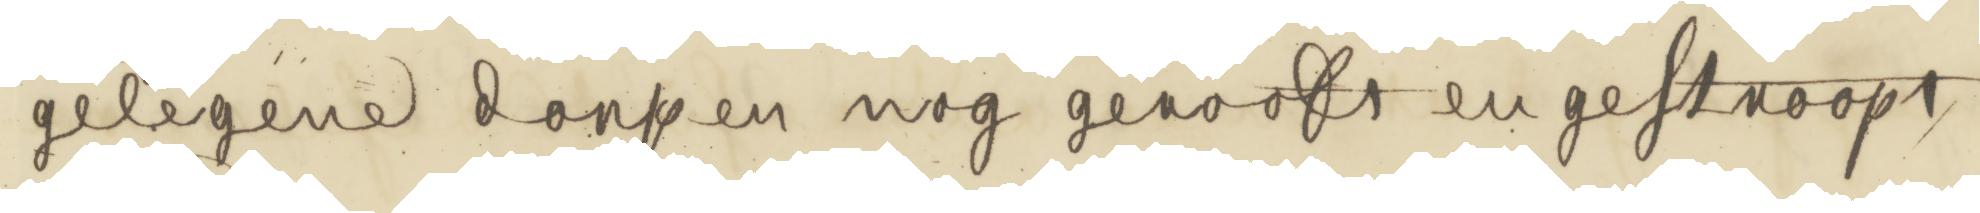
gelegene dorpen nog gerooft en gestroopt
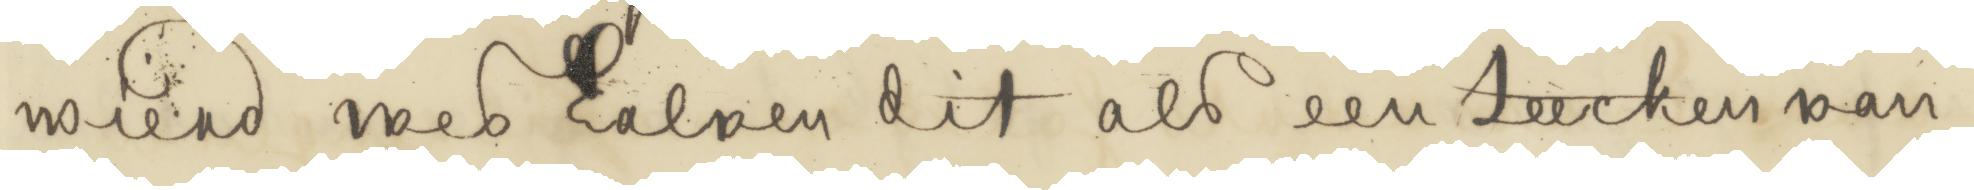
wierd wes halven dit als een teecken van
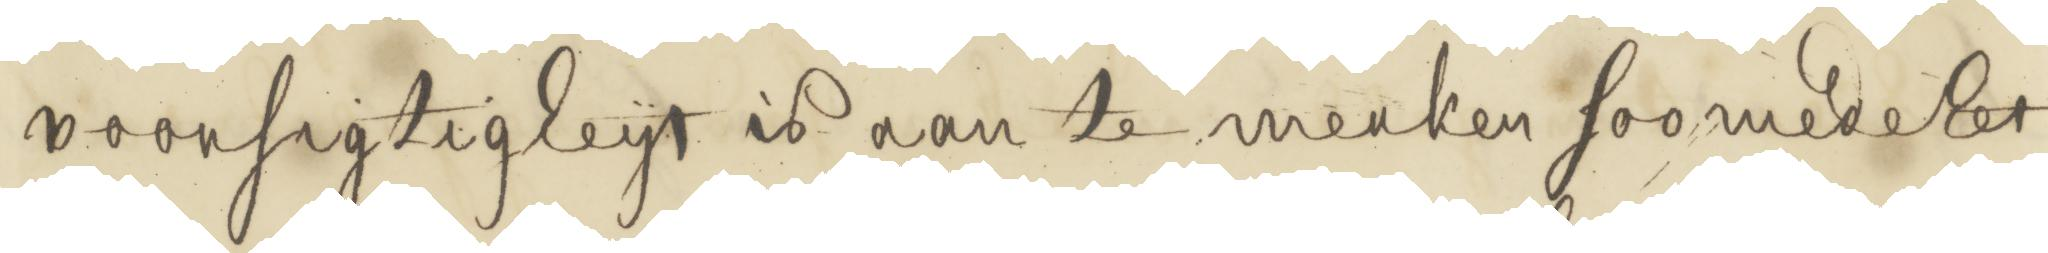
voorsigtigheijt is aan te merken soo mede het
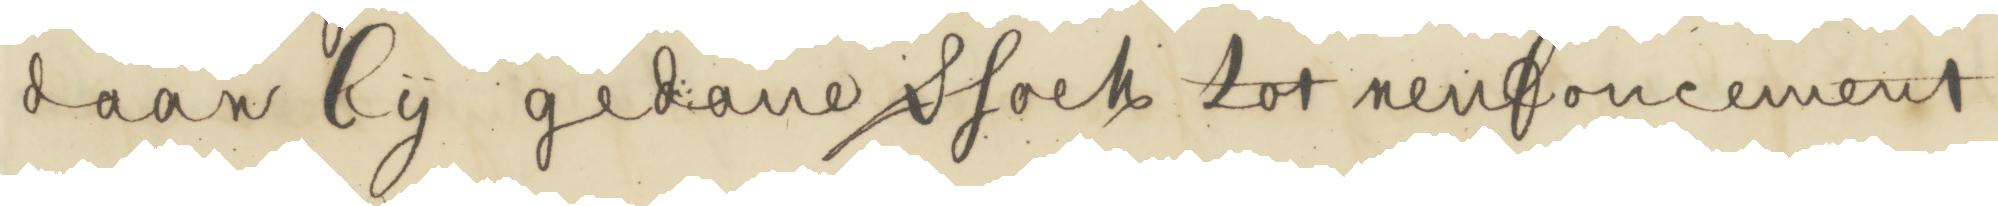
daar bij gedane versoek tot renfoncement
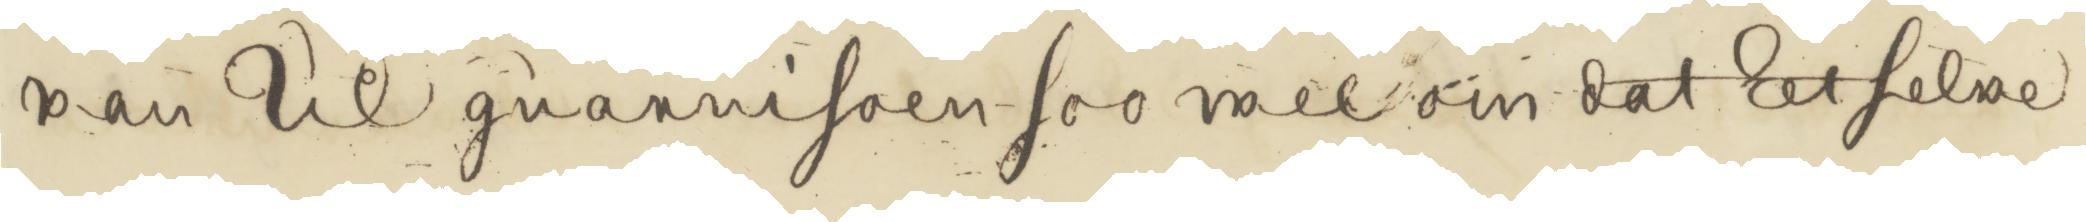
van UE guarnisoen soo wel om dat het selve
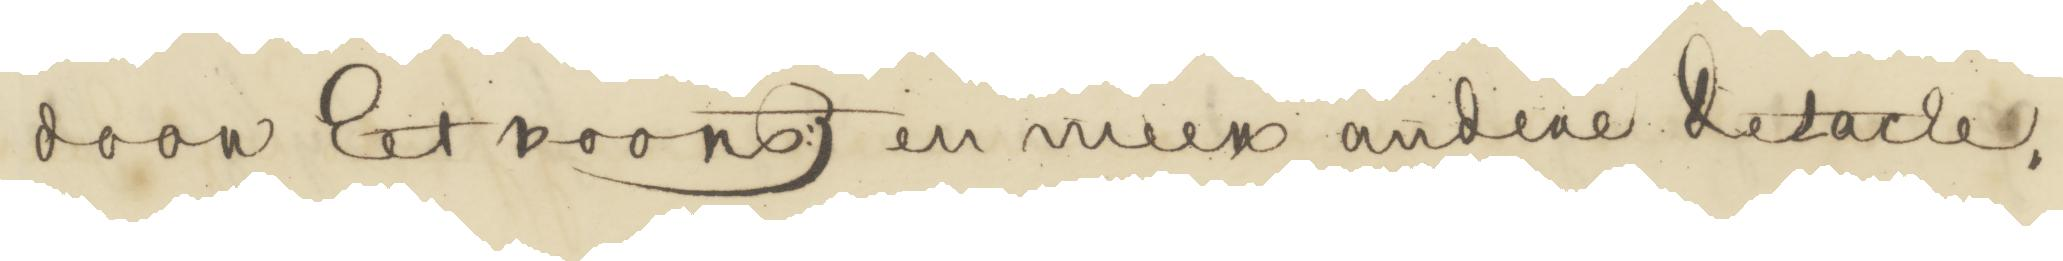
door het voorsz en meer andere detache
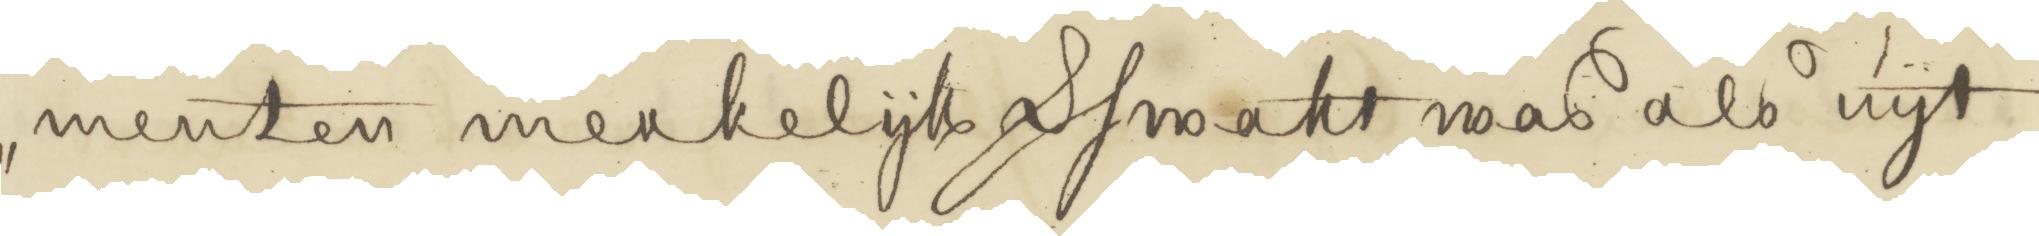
„menten merkelijk verswakt was als uijt
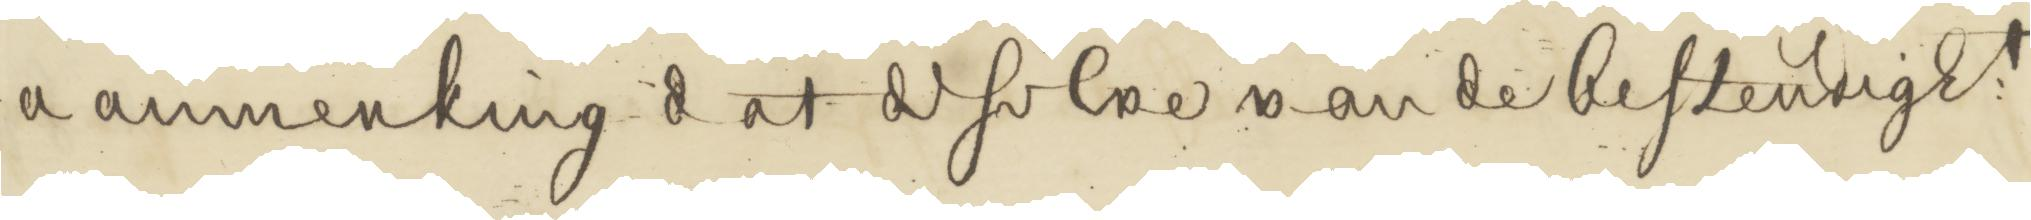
aanmerking dat deselve van de bestendigh:t
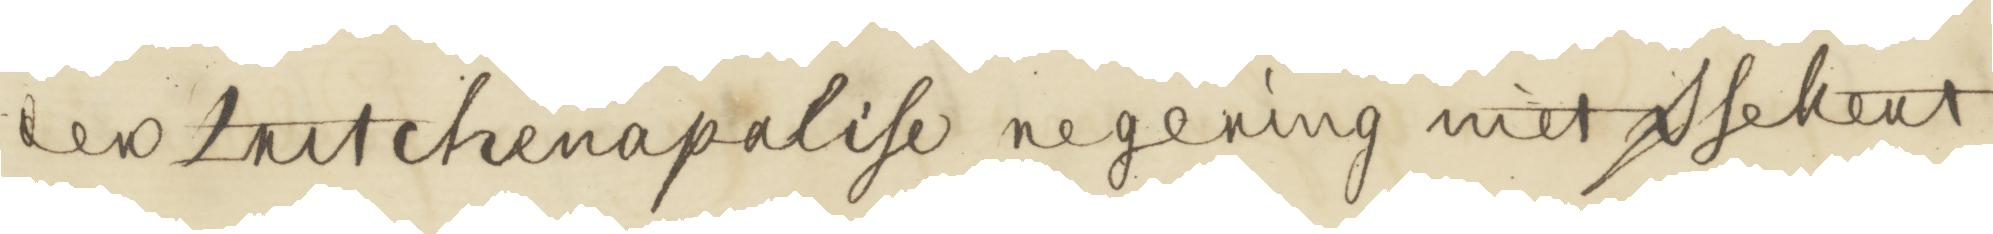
der tritchenapalise regering niet versekert
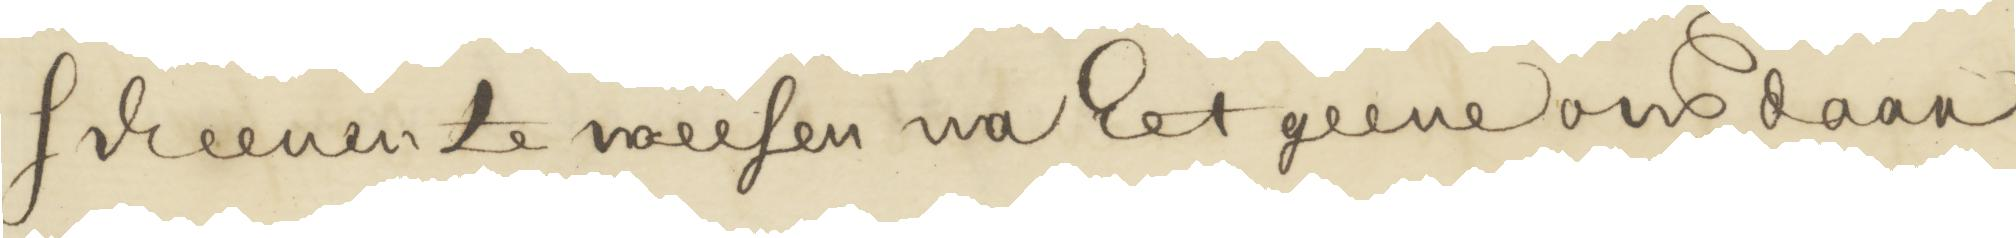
scheenen te weesen na het geene ons daar
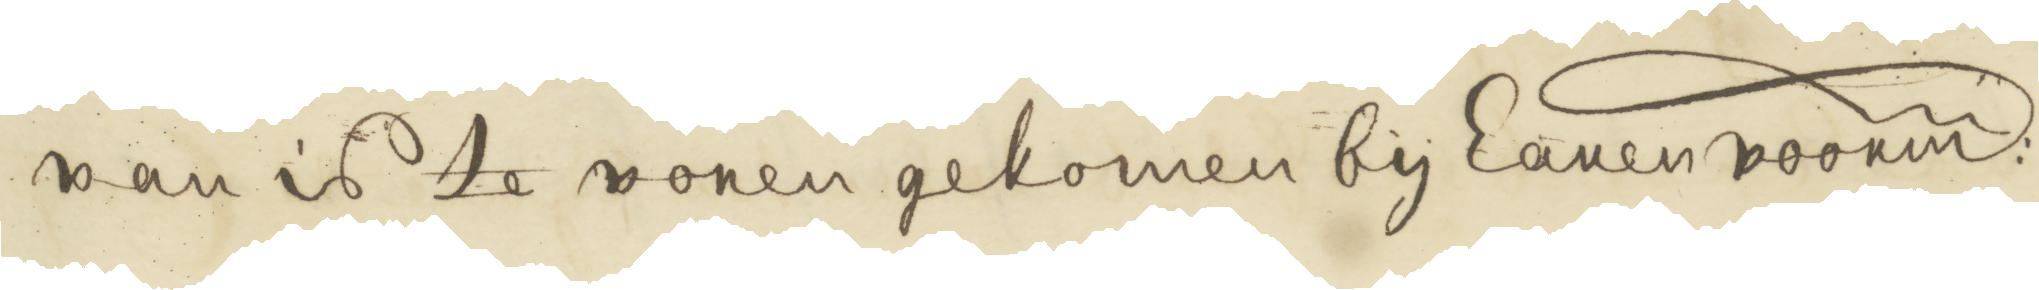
van is te voren gekomen bij haren voorm:
